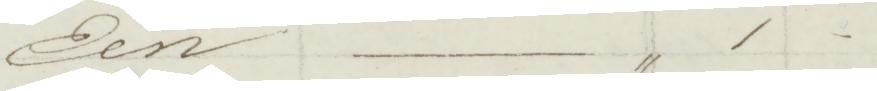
Een — „ 1 —
